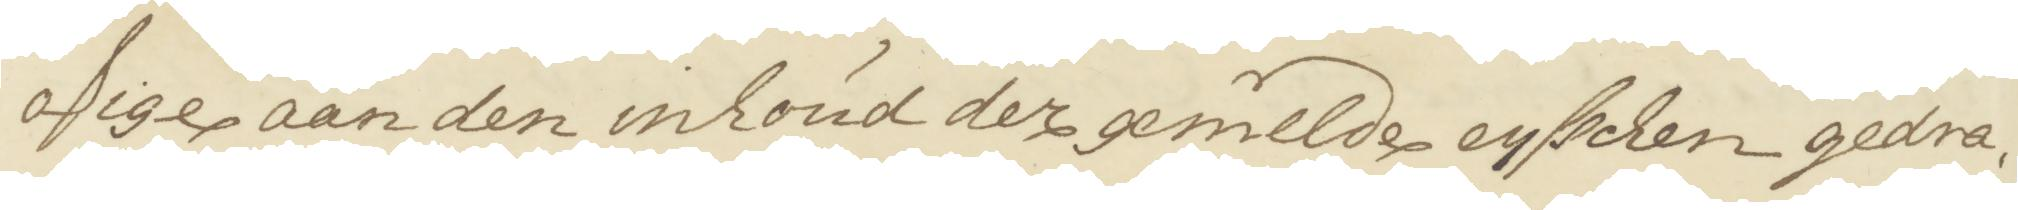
overige aan den inhoud der gemelde eysschen gedra„
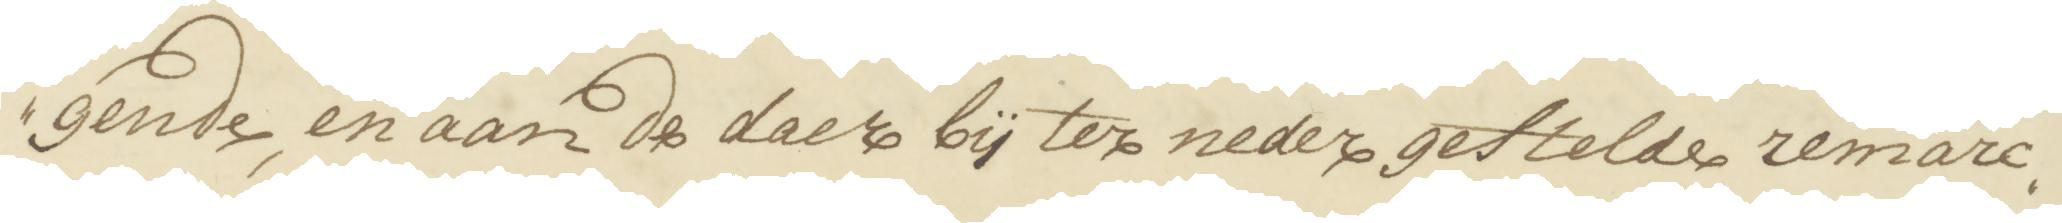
„gende, en aan de daer bij ter neder gestelde remarc„
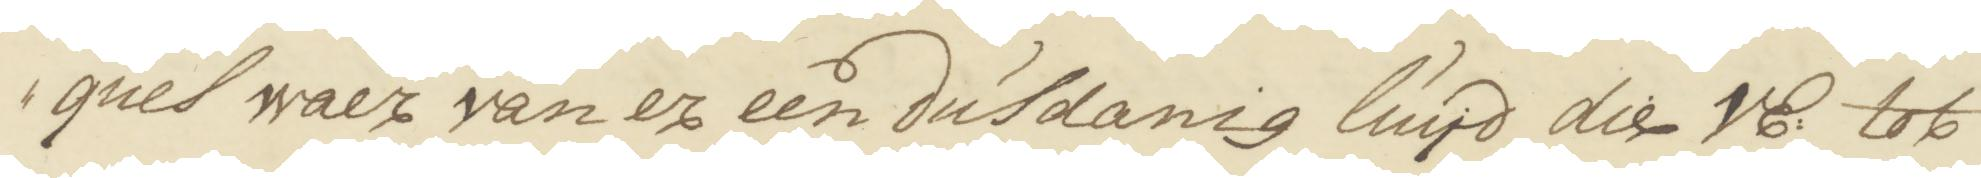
„ques waer van er een dusdanig luijd, die VE: tot
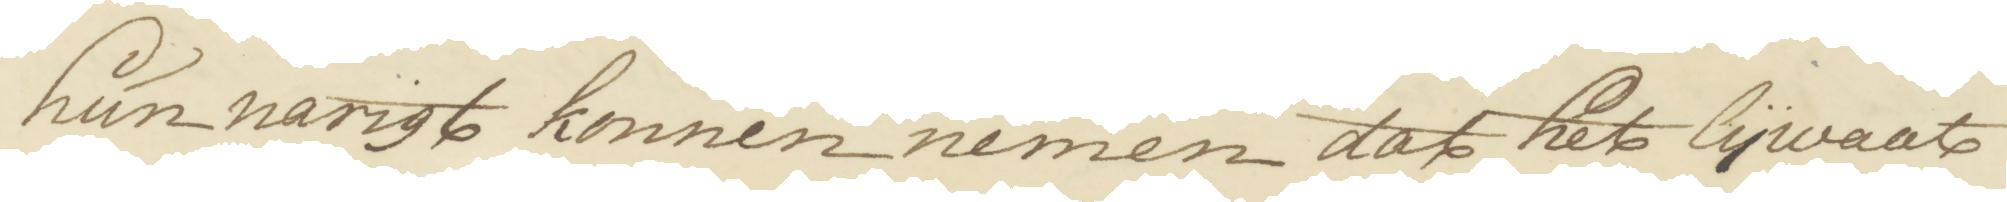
hun narigt konnen nemen dat het lijwaat
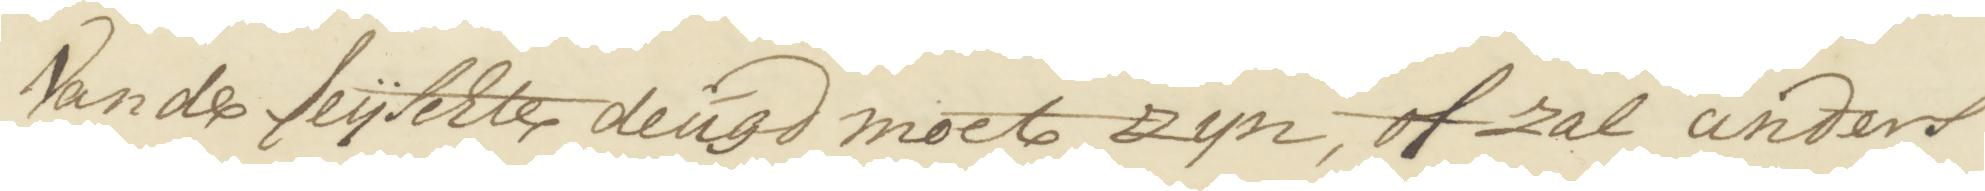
van de vereijschte deugd moet zyn, of zal anders
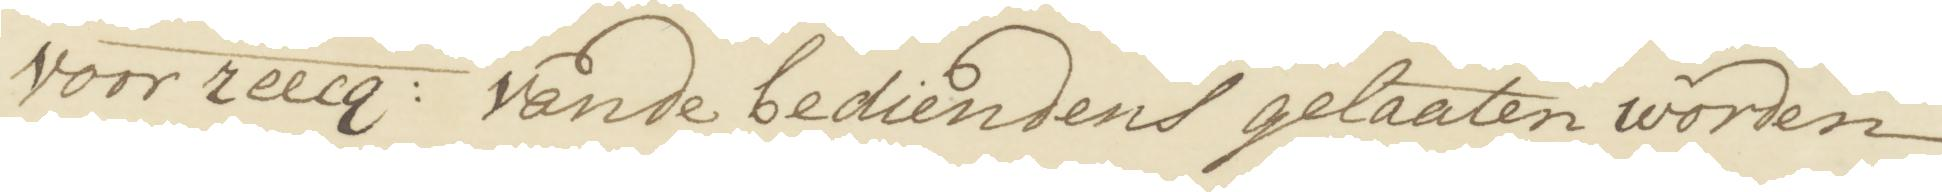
voor reecq: vande bediendens gelaaten worden
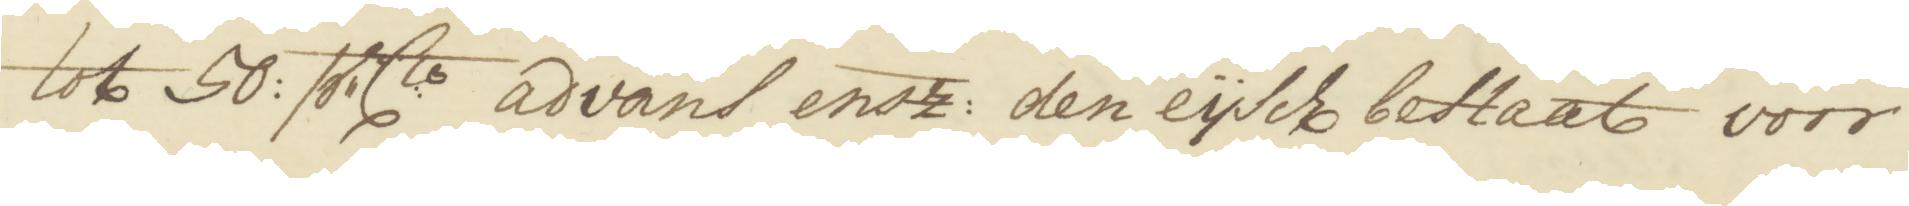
tot 50: p„r C:to advans ensz: den eijsch bestaat voor
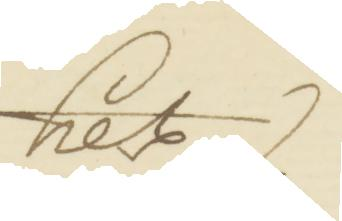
het ./.
